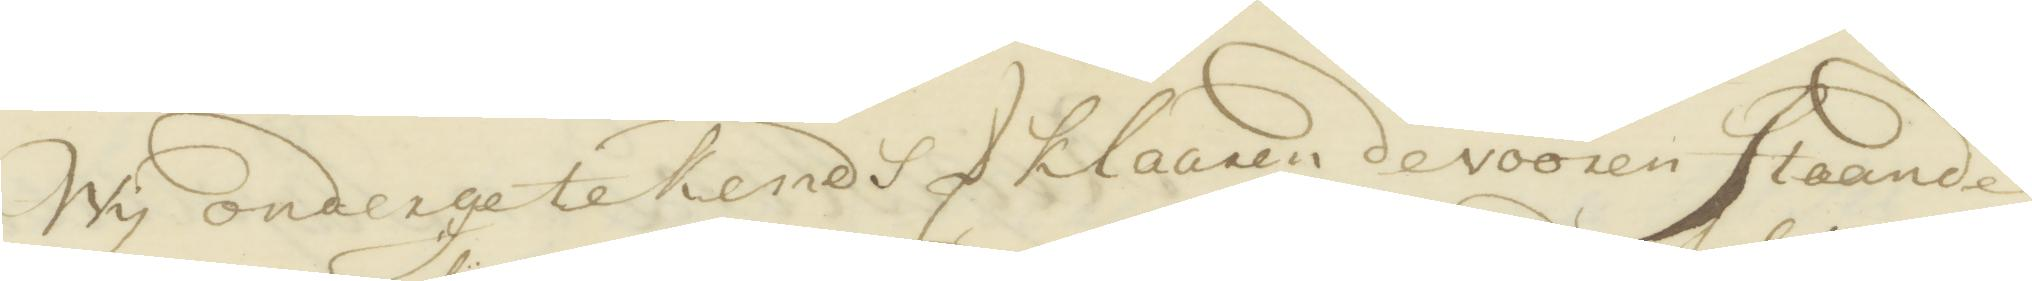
Wij ondergetekends verklaaren de vooren staande
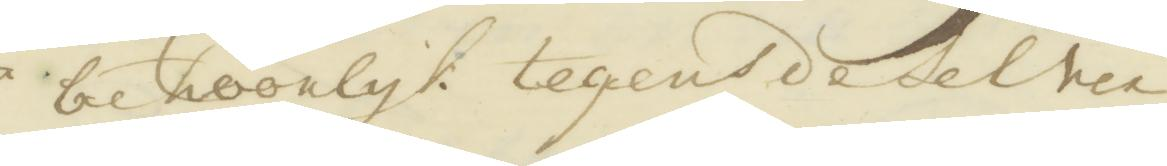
brieven bylagen Jo, na behoorlyk tegens deselver
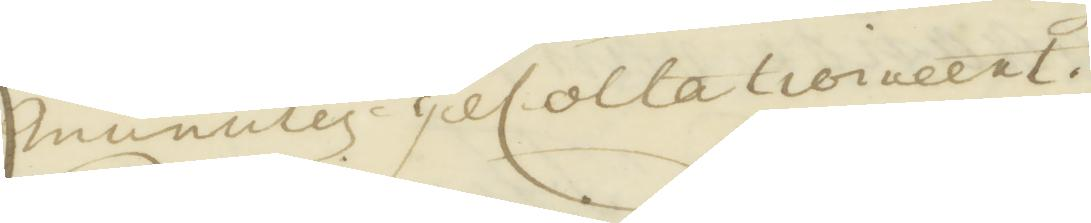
minuten gecollationeert.
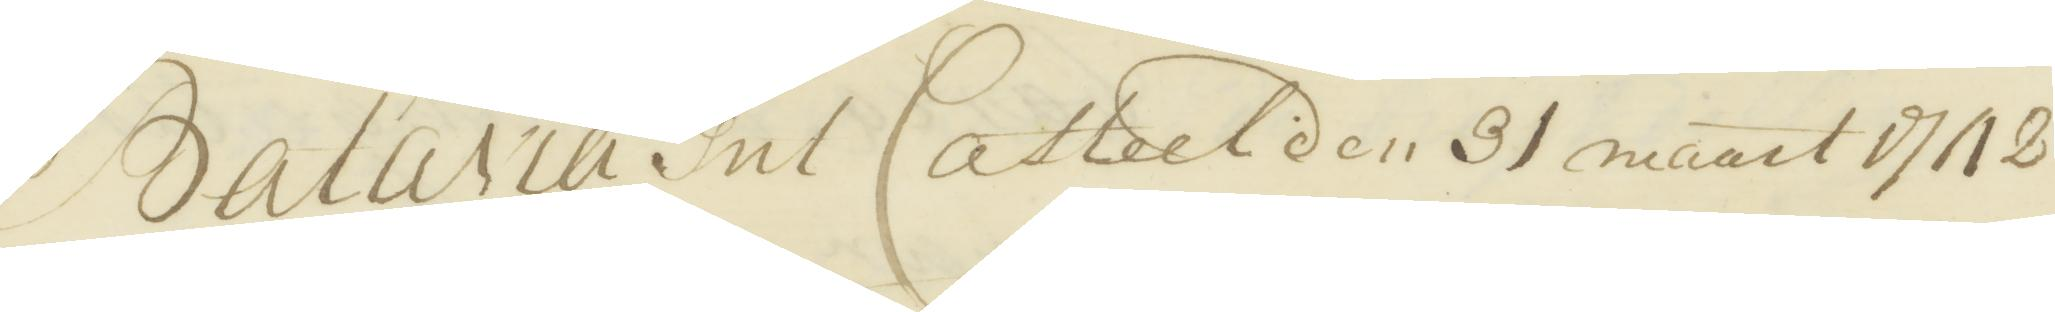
Batavia Int Casteel den 31 maart 1742
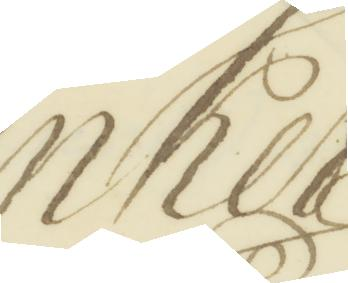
P„s inket
